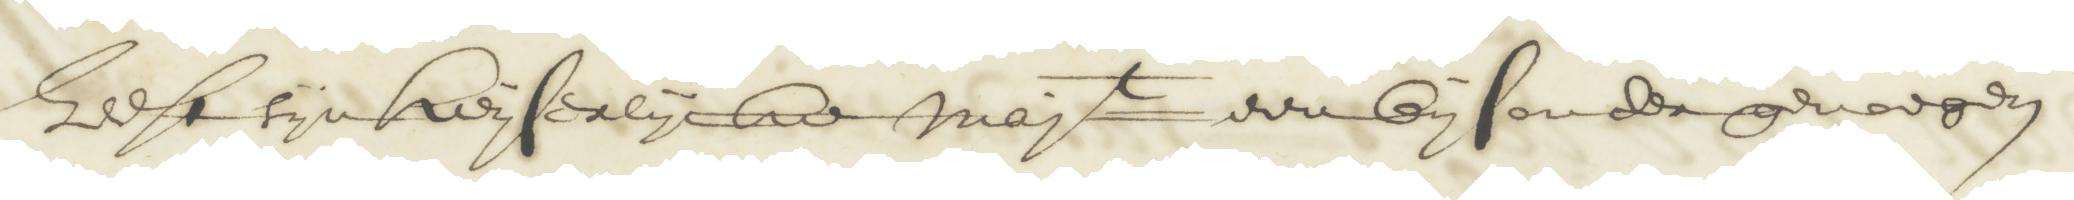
heeft sijn keijserlijcke maj=t een bijsonder genoegen
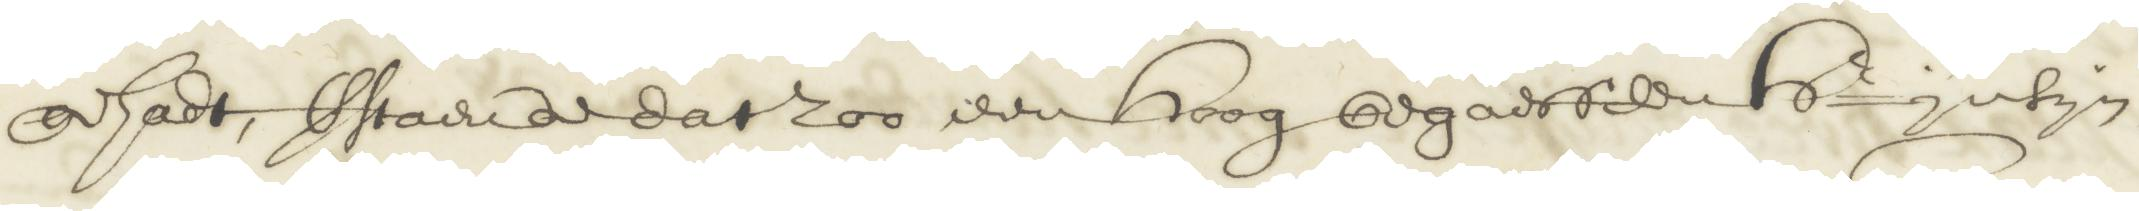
gehadt, verstaende dat zoo een hoog begaeffden H=r in sijn
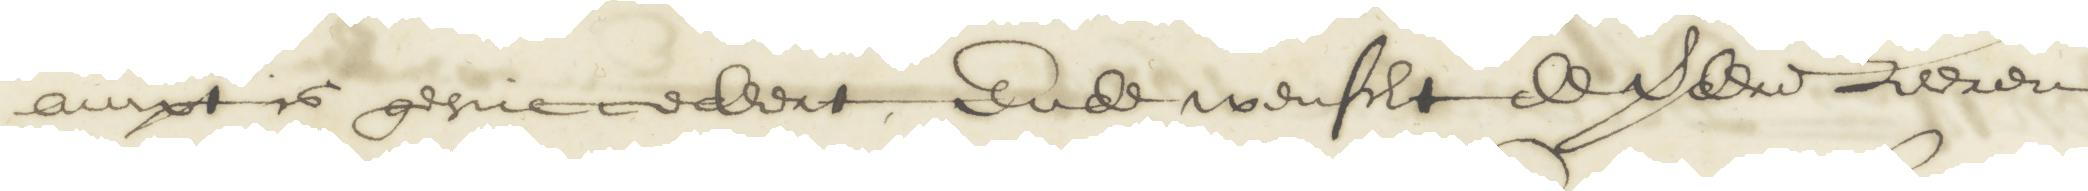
ampt is gesuccedeert, Ende wenscht de verdere Heeren
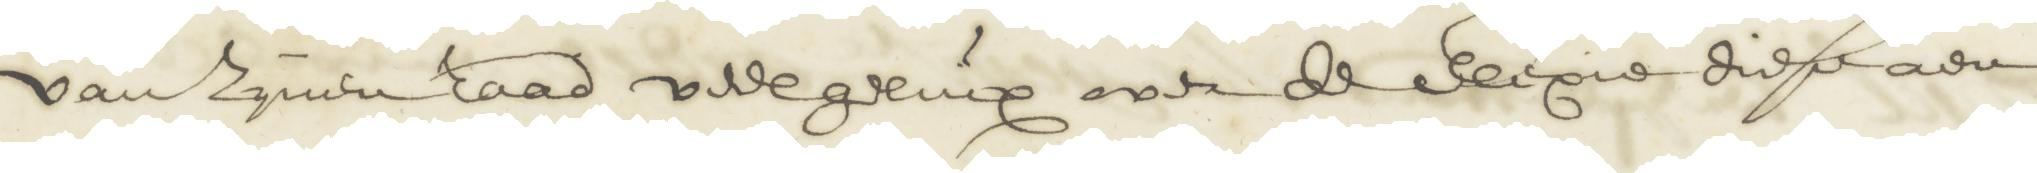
van zijnen raad veel gelucx over de Elexie diese aen
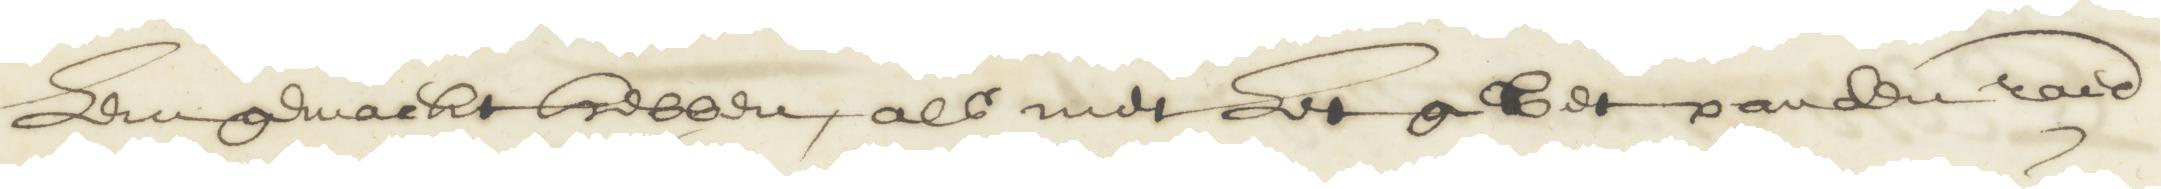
hem gemaekt hebben, als met het gebet van den raed
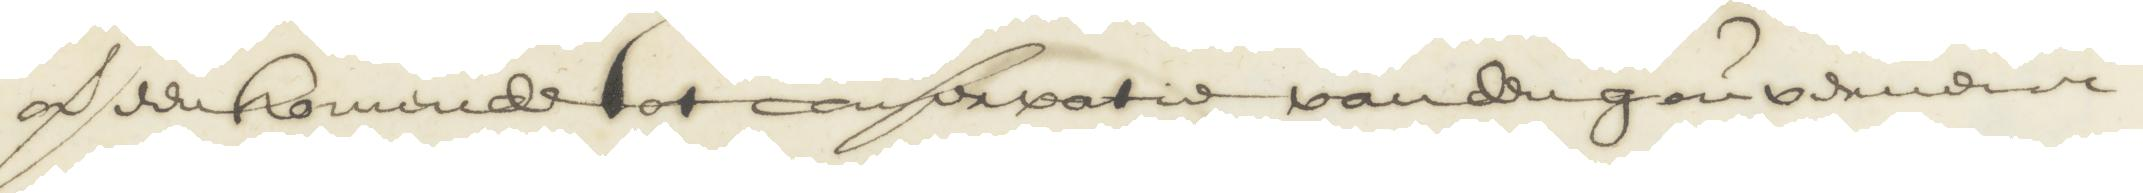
overeenkomende tot conservatie van den gouverneur
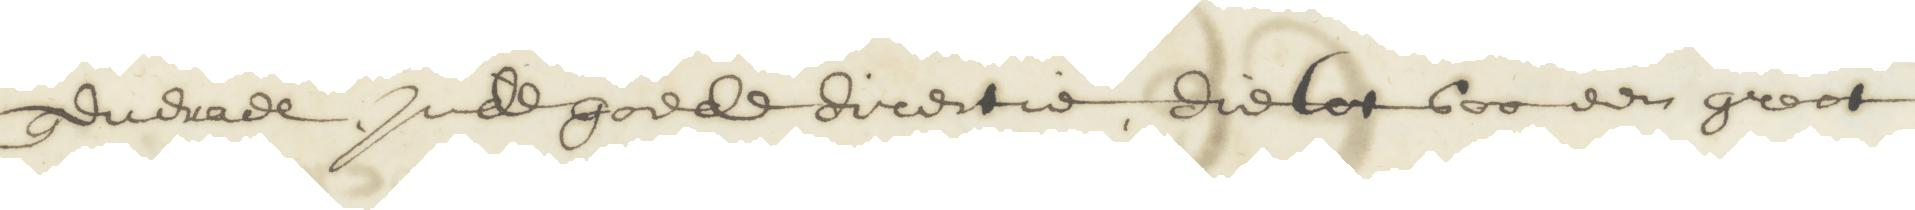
generael, jnde goede directie, die tot soo een groot
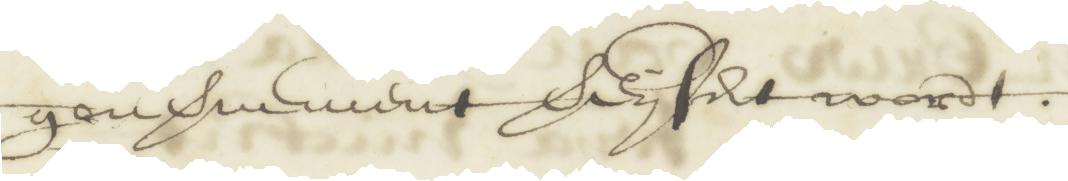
gouvernement vereijscht wordt.
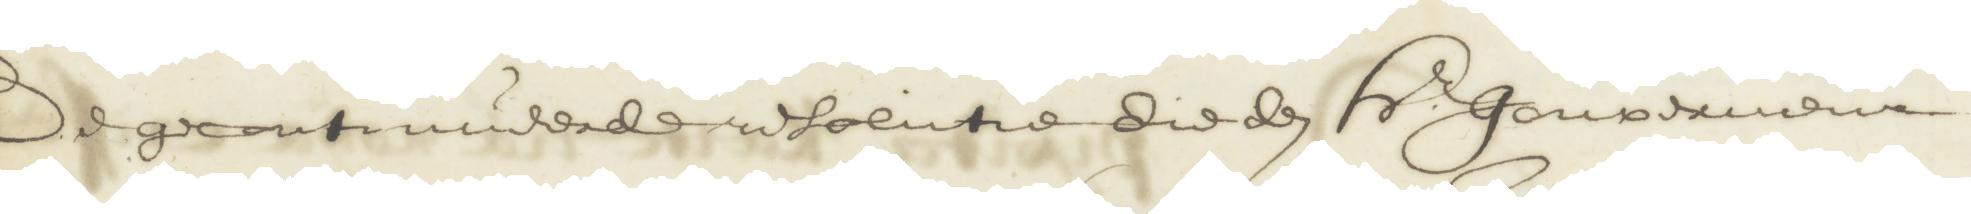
De gecontinueerde resolutie die den H:r gouverneur
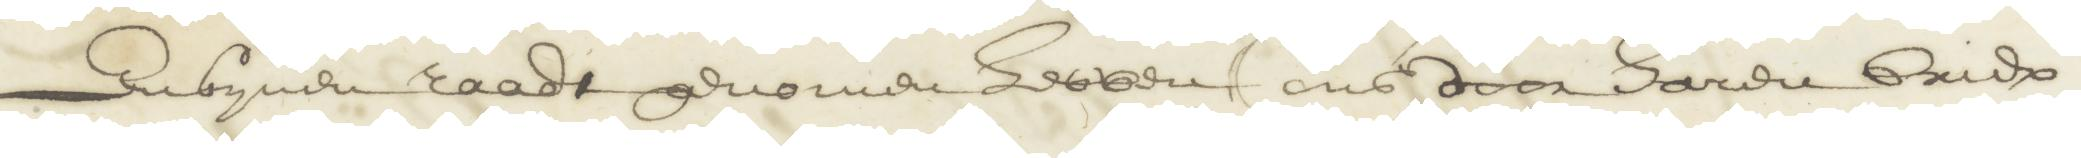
En bij nen raadt genomen hebben (ons door haren briev'
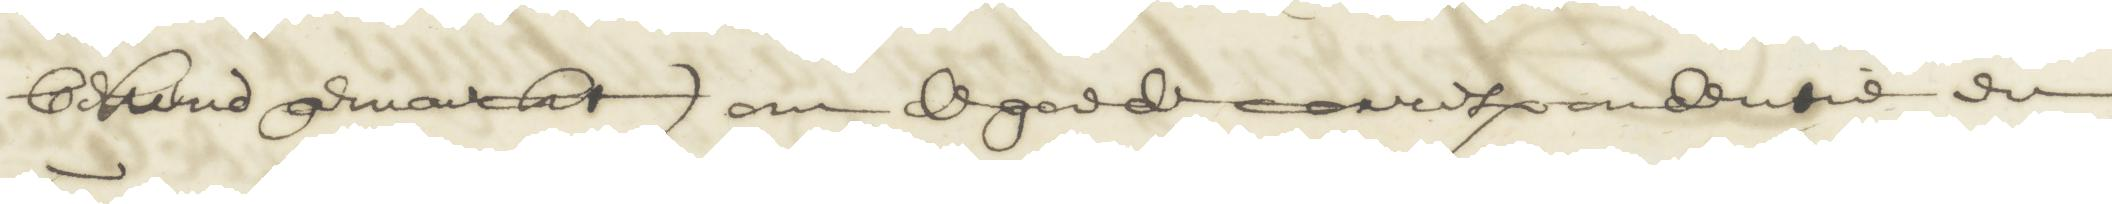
bekend gemaeckt) om de goede correspondentie en
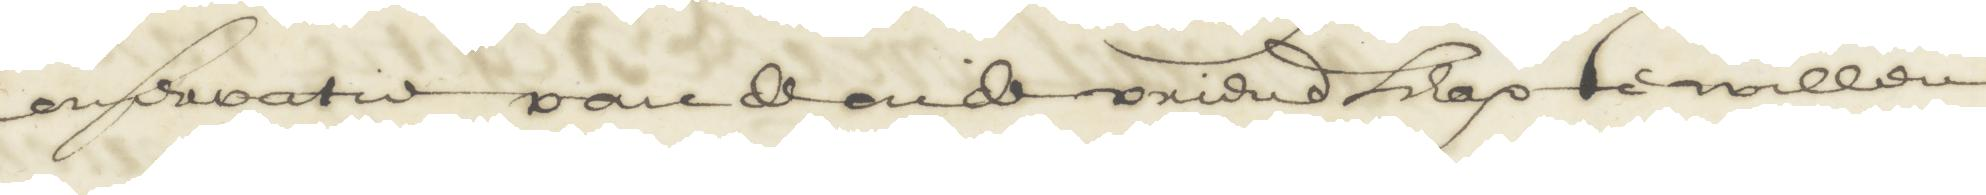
onservatie van de oude vriendschap te willen
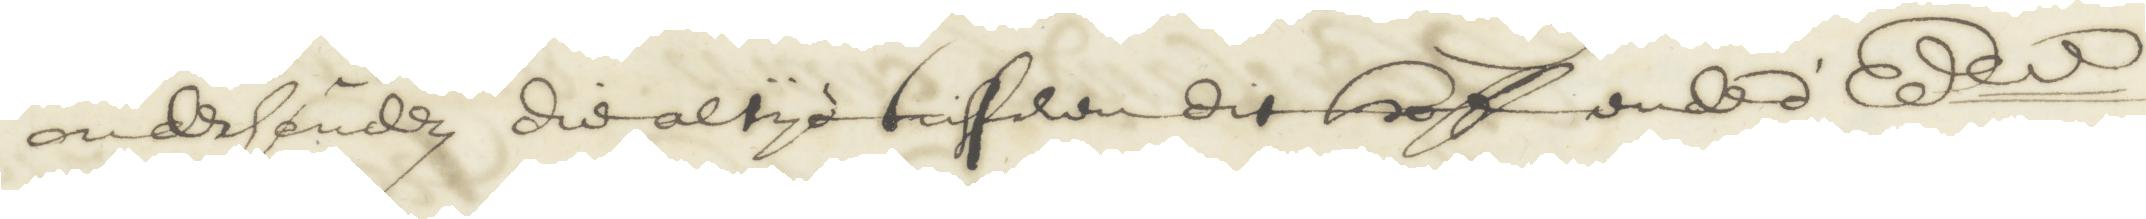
onderhouden die altijd tusschen dit hoff ende d’ Ed=le
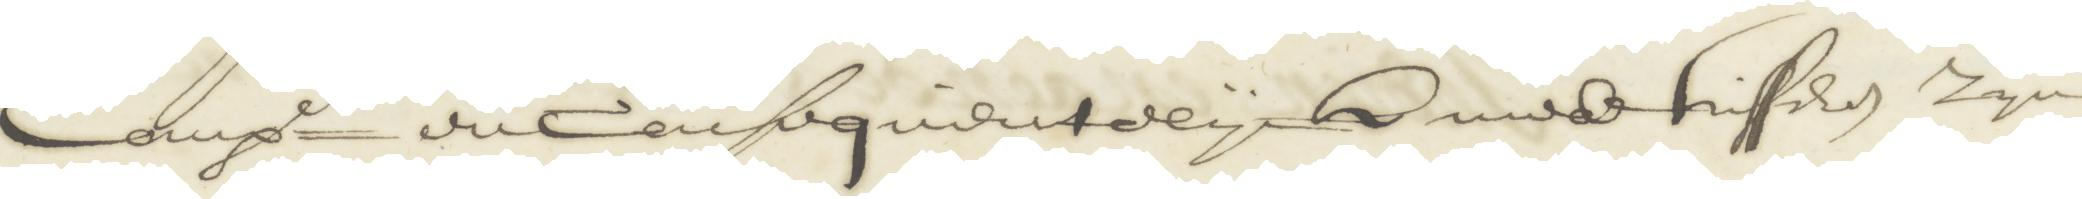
Comp=e en consequentelijck mede tusschen zijn
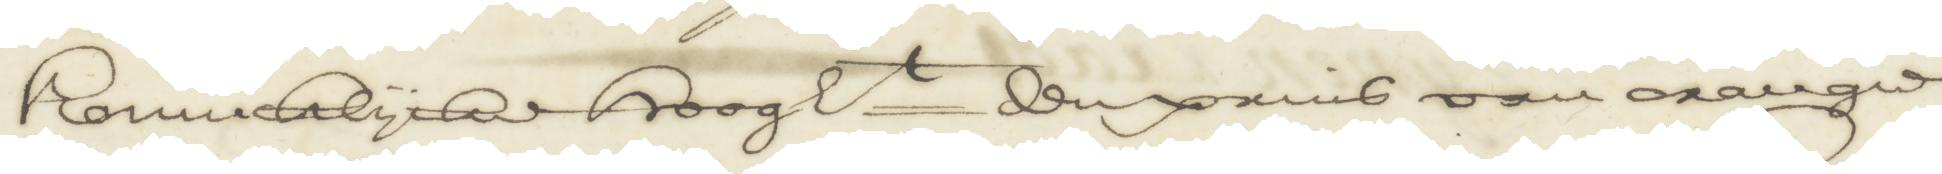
konincklijcke hoogh=t den prins van orangie
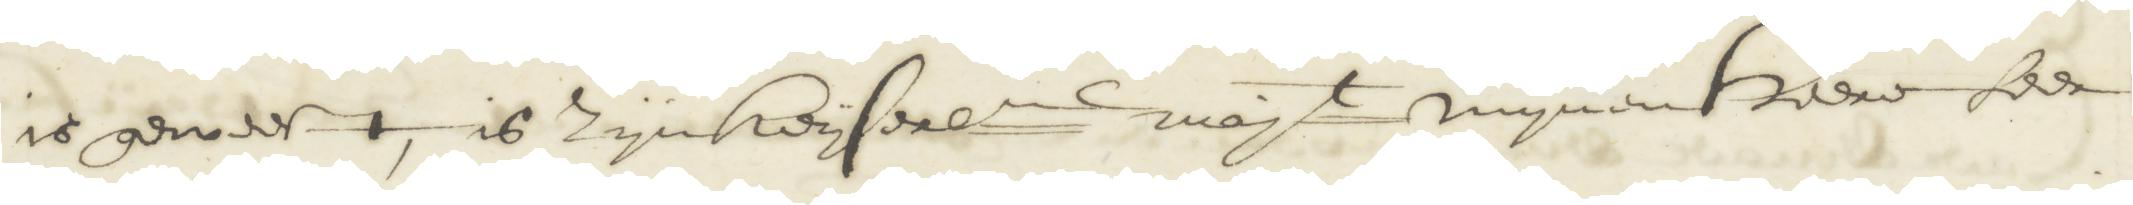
is geweest, is zijn keijserl=e maj=t mijnen Heere seer
